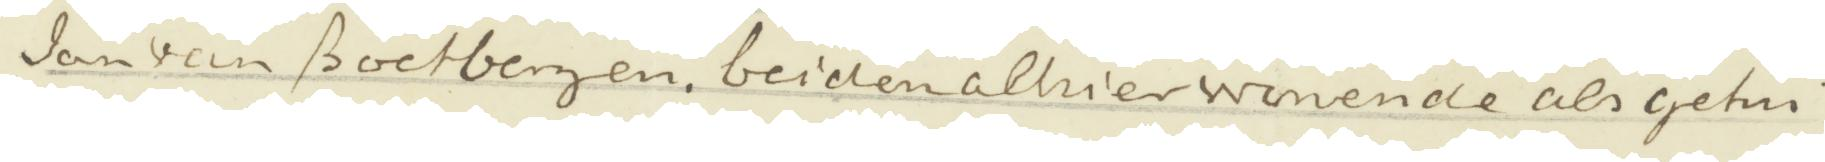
Jan van Boetbergen, beiden alhier wonende als getui
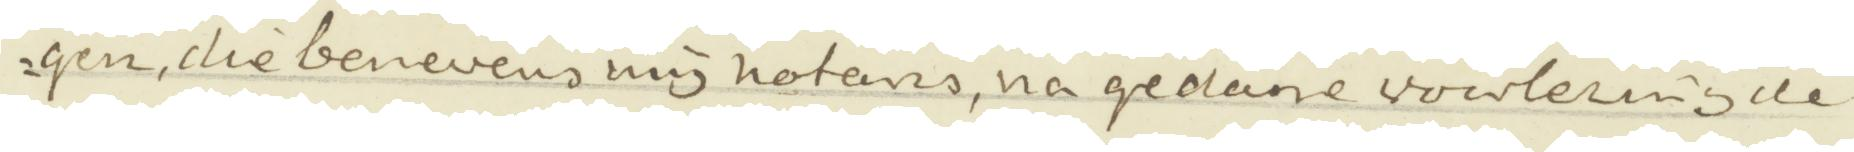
=gen, die benevens mij notaris, na gedane voorlezing de
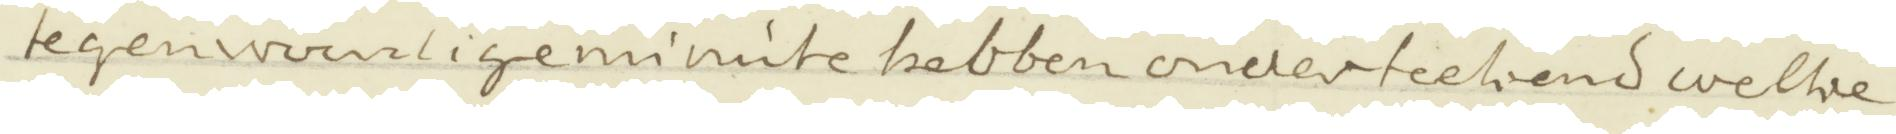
tegenwoordige minute hebben onderteekend welke
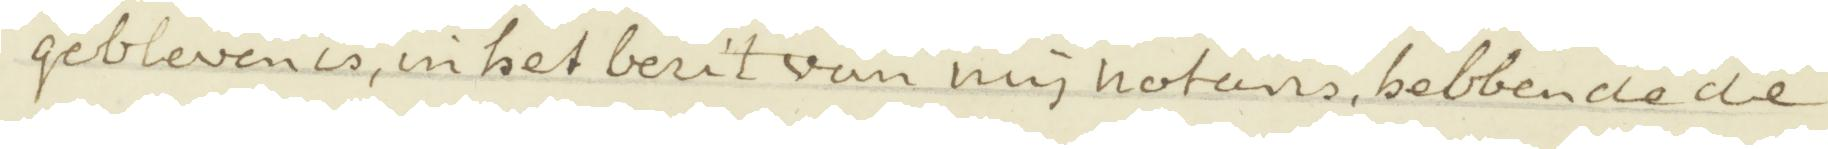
gebleven is in het bezit van mij notaris, hebbende de
